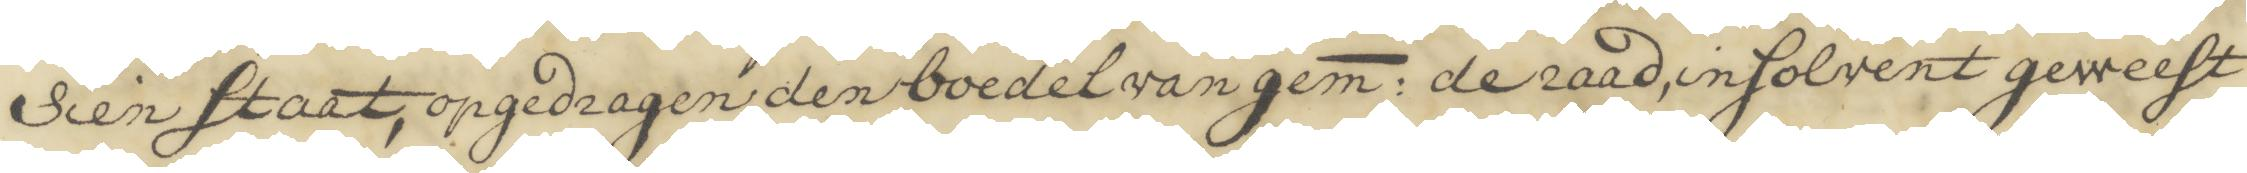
sien staat, opgedragen, den boedel van gem: de raad, insolvent geweest
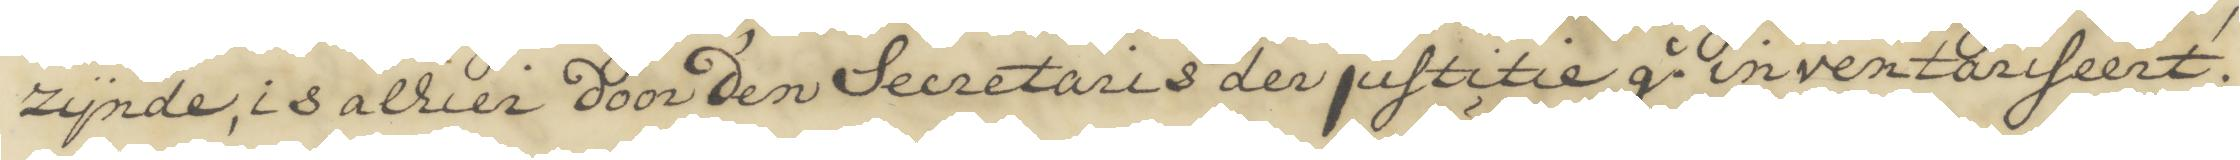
zijnde, is alhier door den secretaris der justitie g.'inventariseert
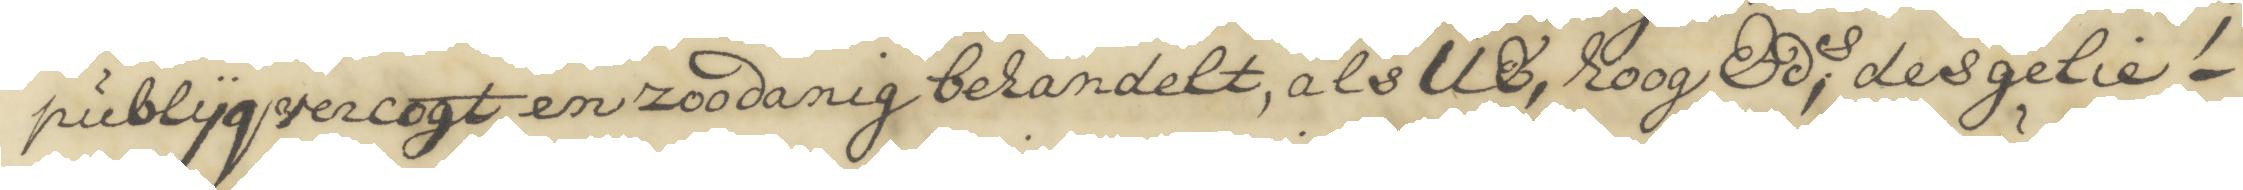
publijq vercogt, en zoodanig behandelt, als UE, hoog Ed,s des gelie-
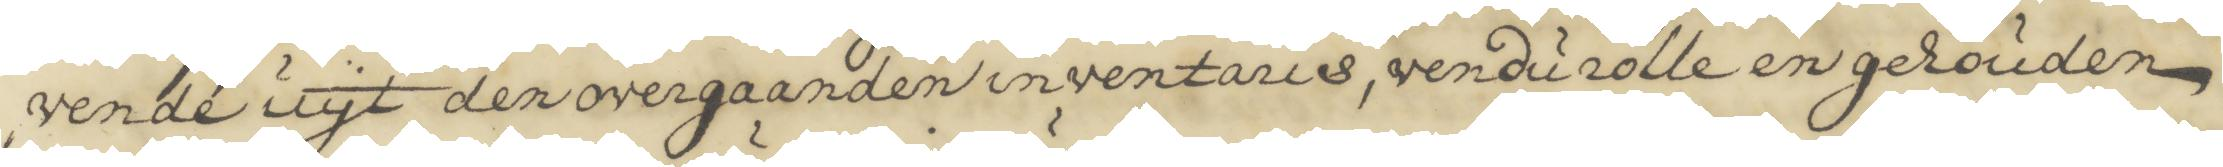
vende uijt den overgaanden inventaris, vendurotte en gehouden
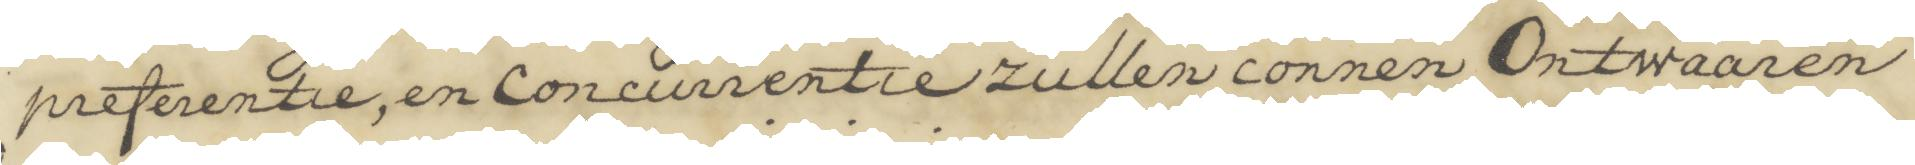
preferentie, en concurrentie zullen connen Ontwaaren
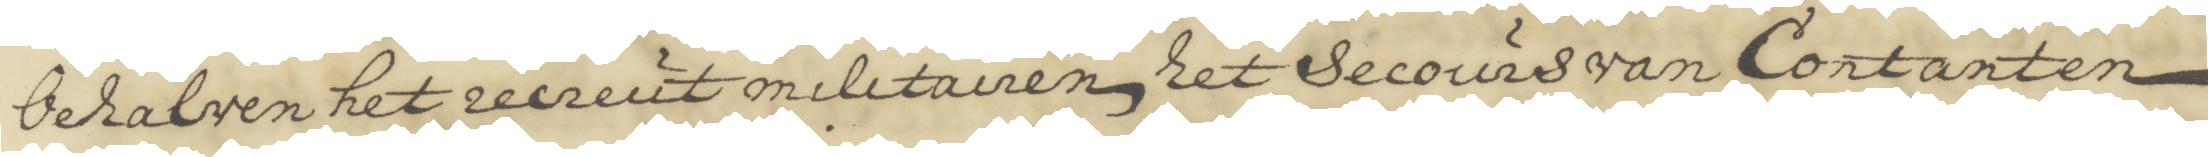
behalven het recreut militairen het secours van Contanten
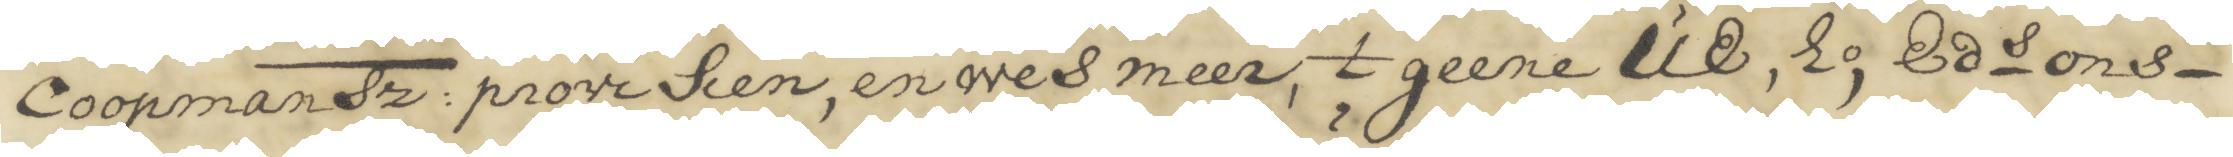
Coopmansz: provisien, en wes meer, t geene UE, h,o Ed-s ons —
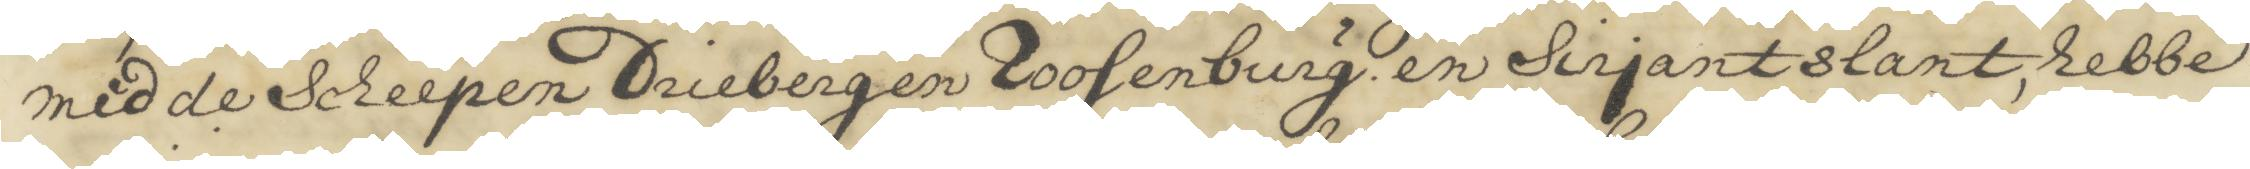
med de scheepen driebergen roosenburg. en Sirjantslant, hebbe
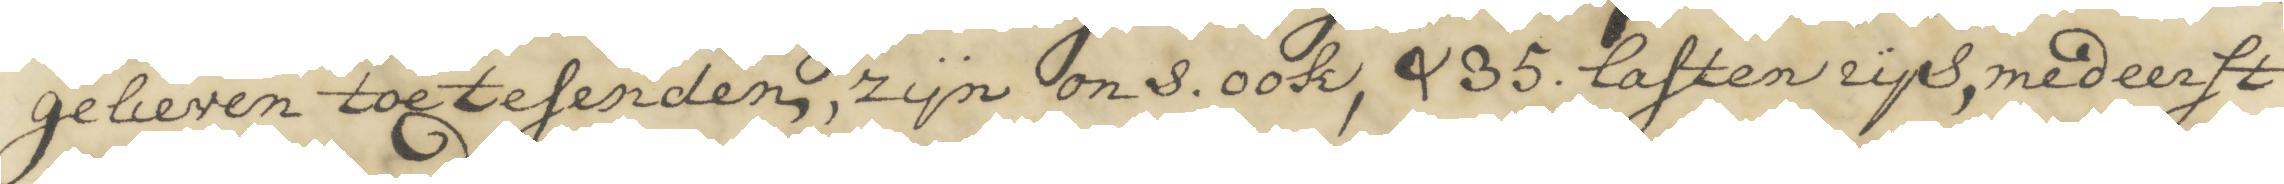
gelieven toe tesenden, zijn ons. ook, 435. lasten rijs, med eerst
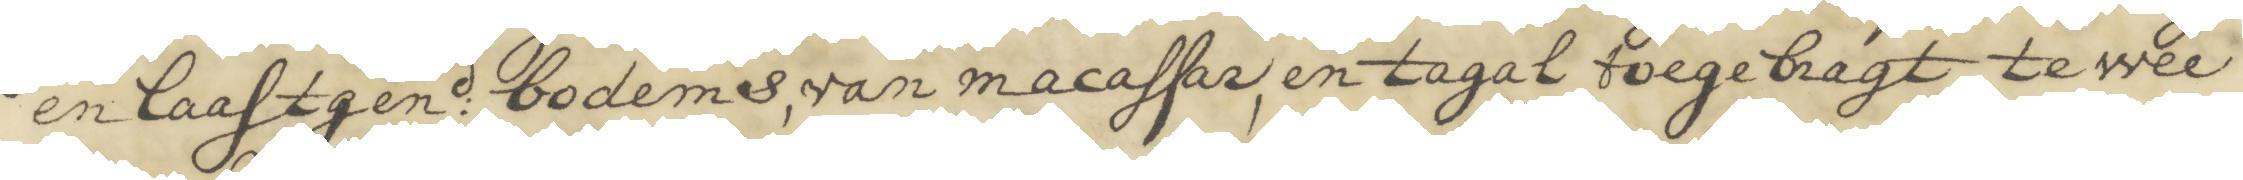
en laast gen:d bodems, van macassar, en tagal toegebragt, te wee
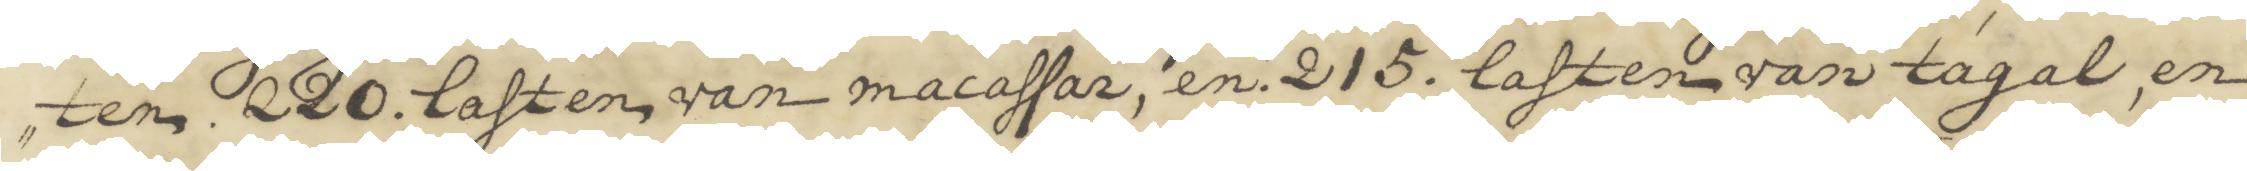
„ten. 220. lasten van macassar, en. 215. lasten van tagal, en
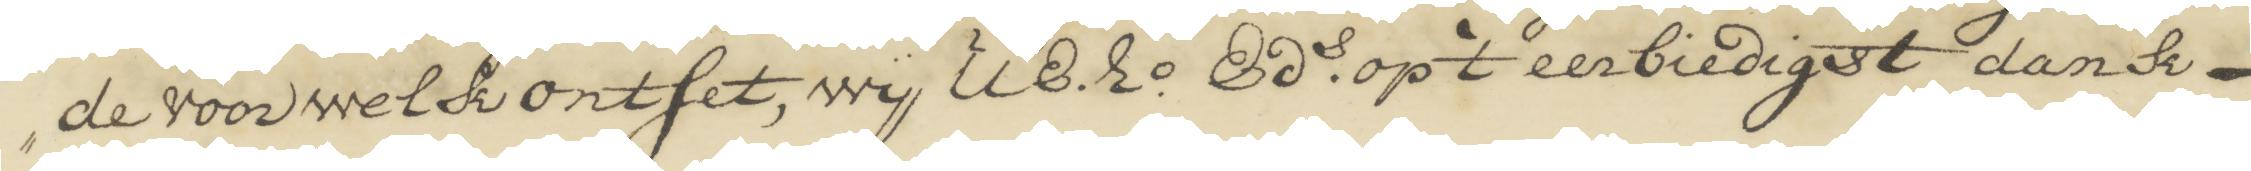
„de voor welk ontset, wij UE. h.o Ed.s op ’t eerbiedigst dank —
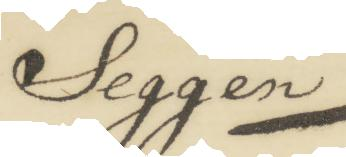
Seggen
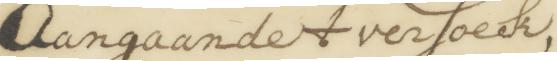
Aangaande t versoek,
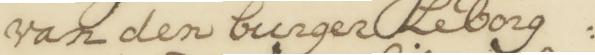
van den burger Leborg:
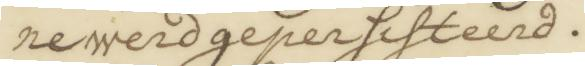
ne werd gepersisteerd.
